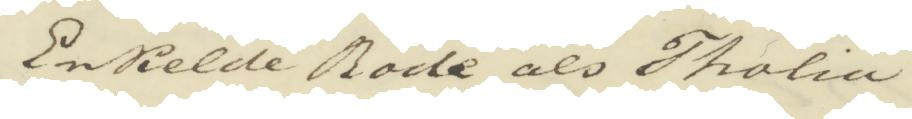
Enkelde Rode als Thalia
